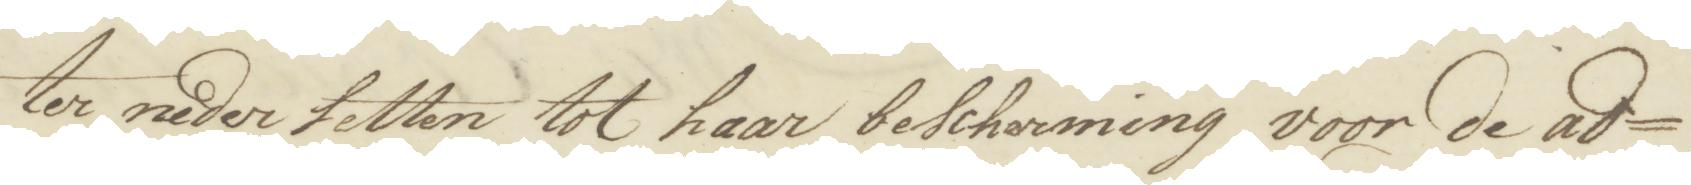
ter neder setten tot haar bescherming voor de ad„
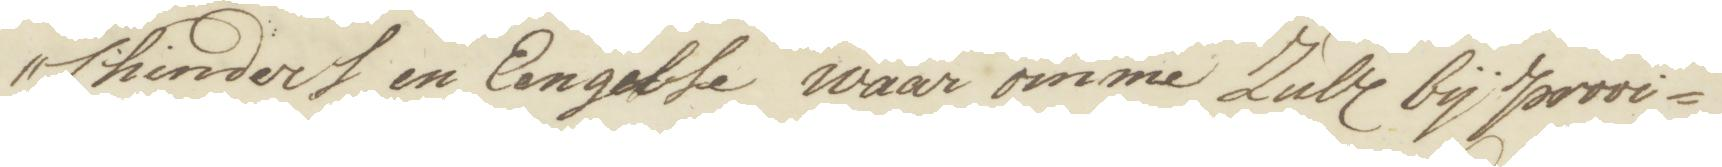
„Chinders en Eengelse waar omme Zulx bij provi„
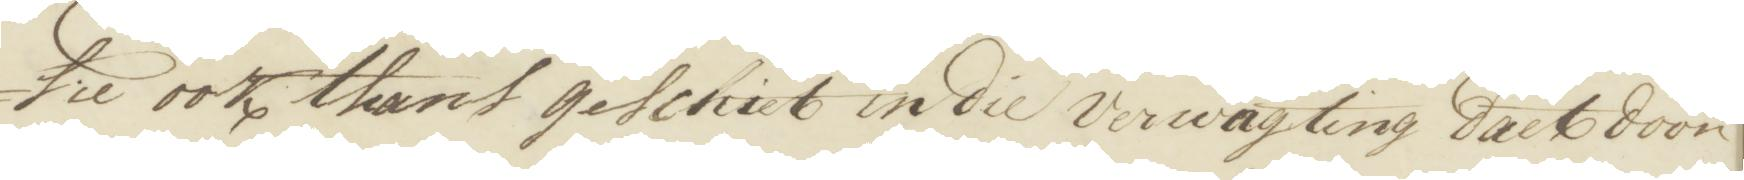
„sie ook thans geschiet in die verwagting daet door
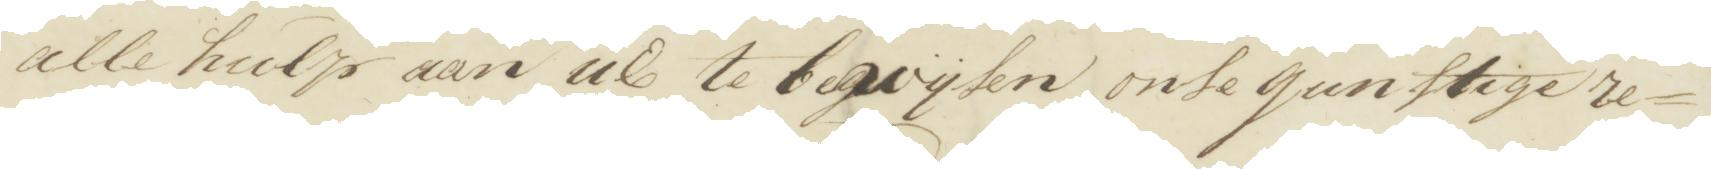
alle hulp aan uE te bewijsen onse gunstige re„
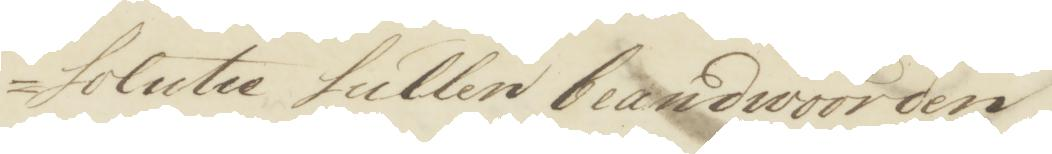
„solutie sullen beandwoorden
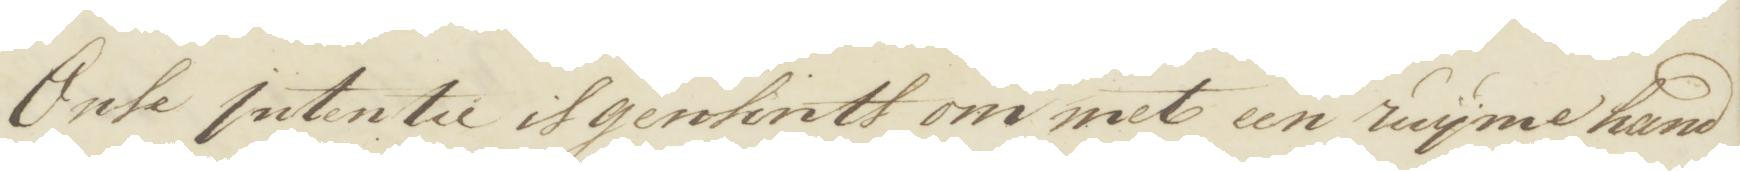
Onse Jntentie is gensints om met een ruijme hand
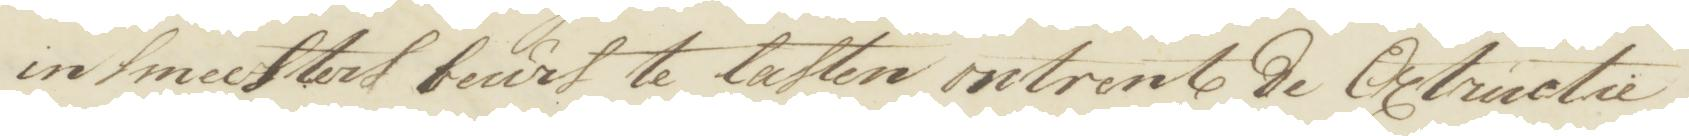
in smeesters beurs te tasten ontrent de Extructie
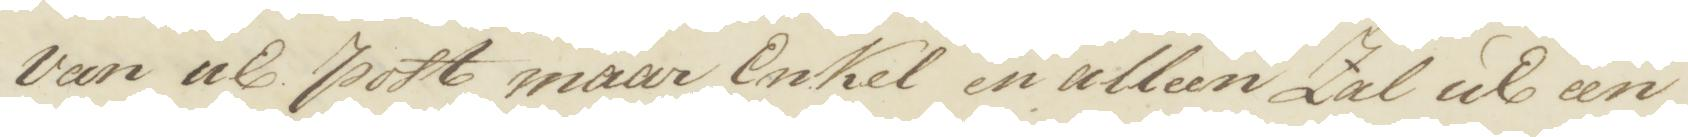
van uE post maar Enkel en alleen Zal uE een
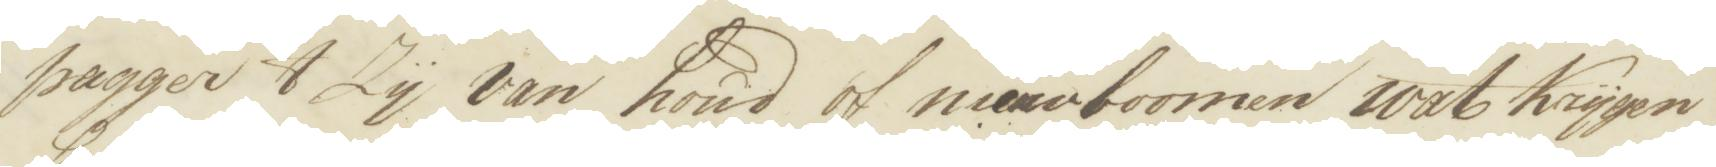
pagger ’t Zij van houd of niewboomen wat krijgen
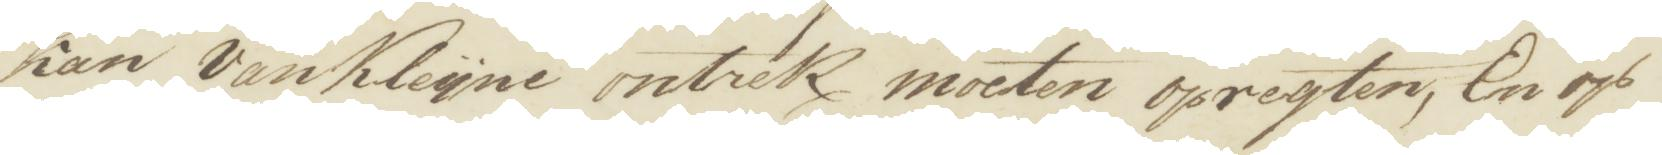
kan van kleijne ontrek moeten opregten, En op
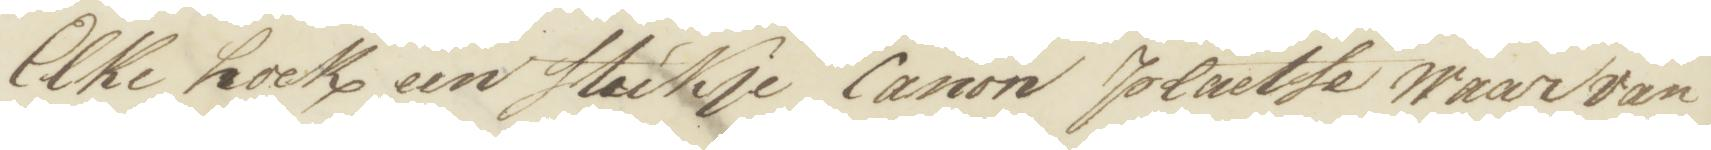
Elke hoek een stukje Canon plaetse waar van
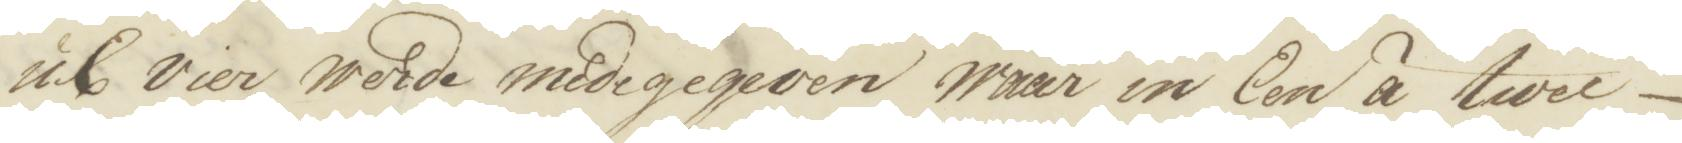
UE vier werde medegegeven waar in Een â twee —
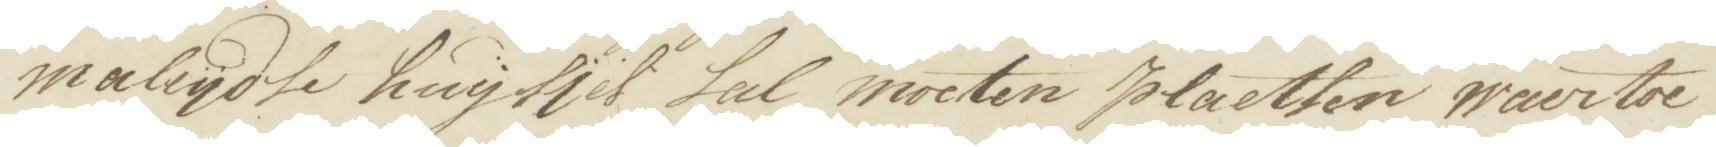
maleijdse huijsjes sal moeten plaetsen waertoe
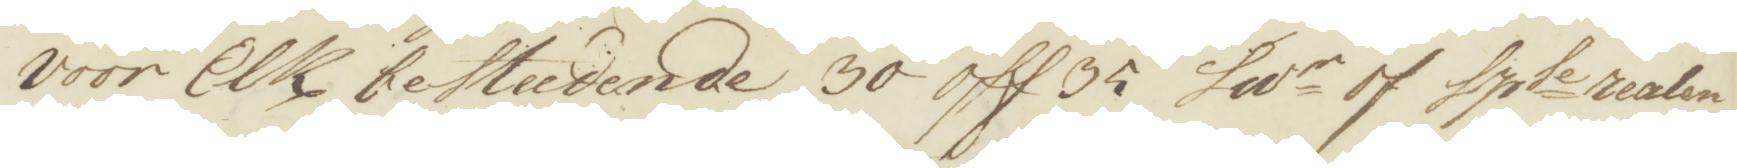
voor Elk besteedende 30 off 35 Sw=r of Sp=se realen
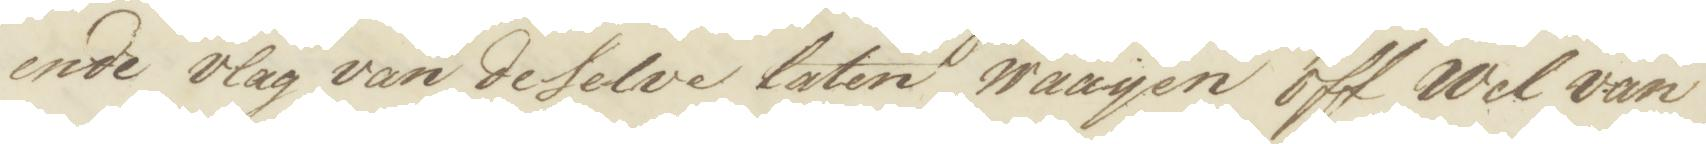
ende vlag van deselve laten waaijen off wel van
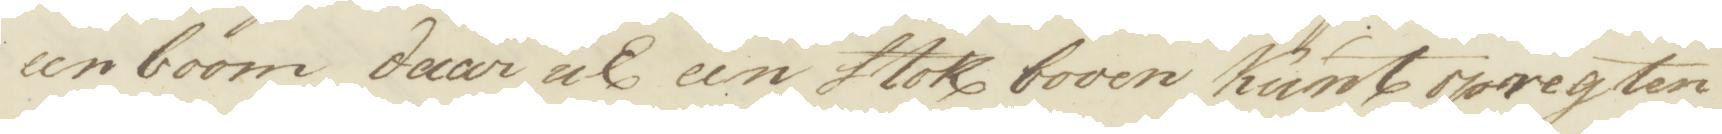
een boom daar uE een stok boven kunt opregten
